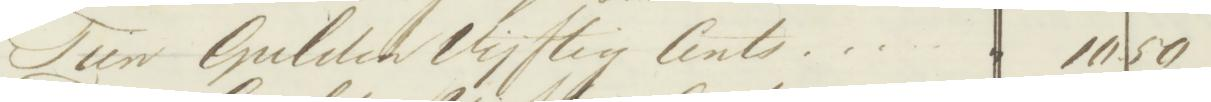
Tien Gulden Vijftig Cents . . . „ 10.50
